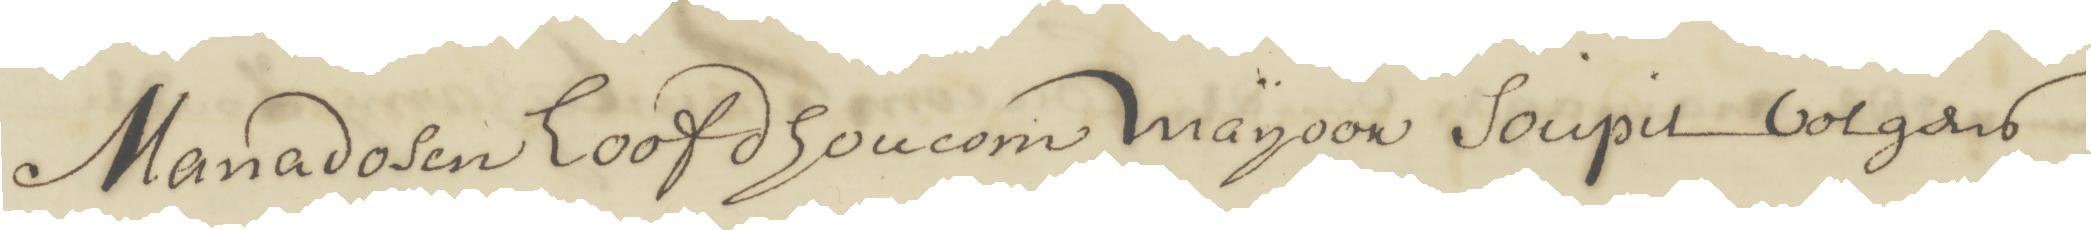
Manadosen hoofd houcom maijoor soupit volgens
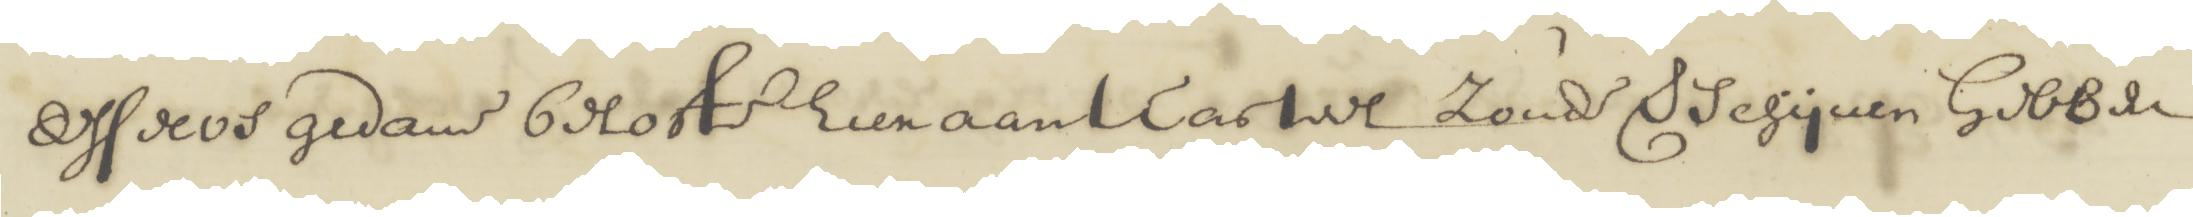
desselvs gedane belofte hier aan t Casteel zoude verschijnen hebben
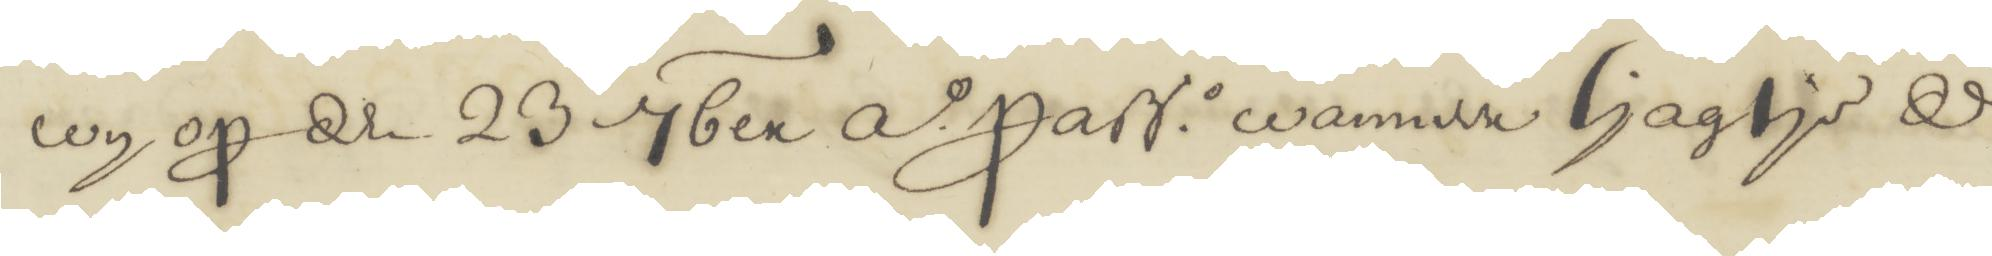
wy op den 23 7ber a.o pass.o wanneer tjagtje de
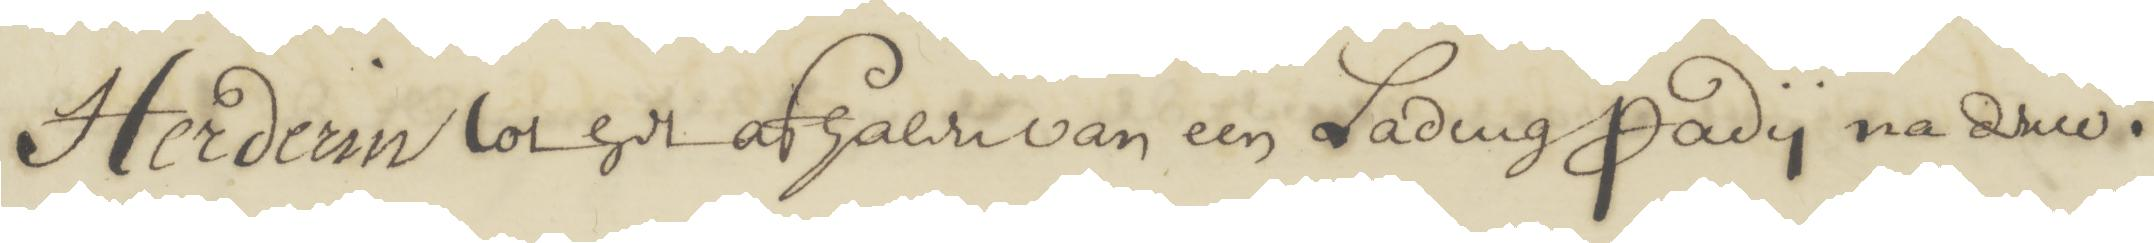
Herderin tot het afhalen van een Lading Padij na derw.ts
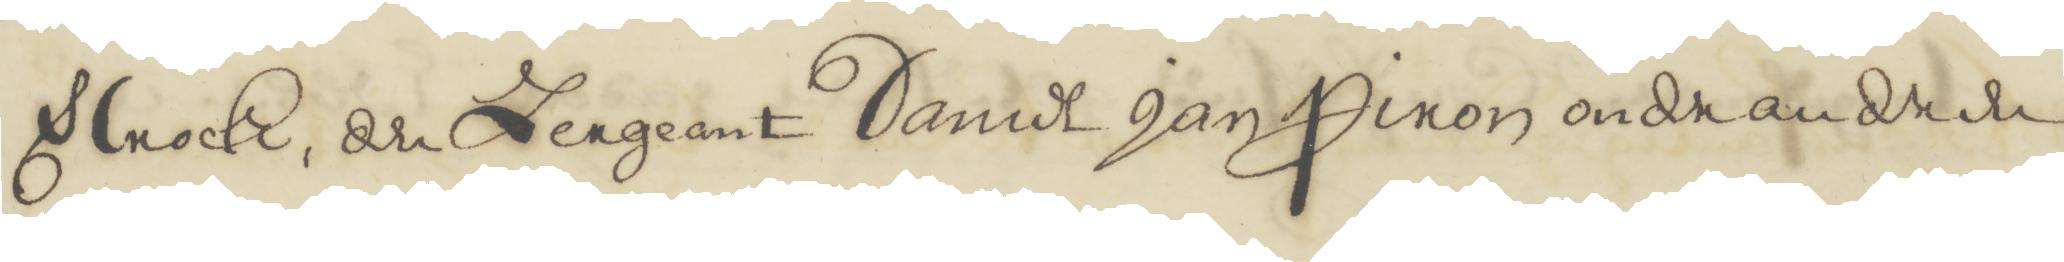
vertrock, den Zergeant Daniel jan Piron onder anderen
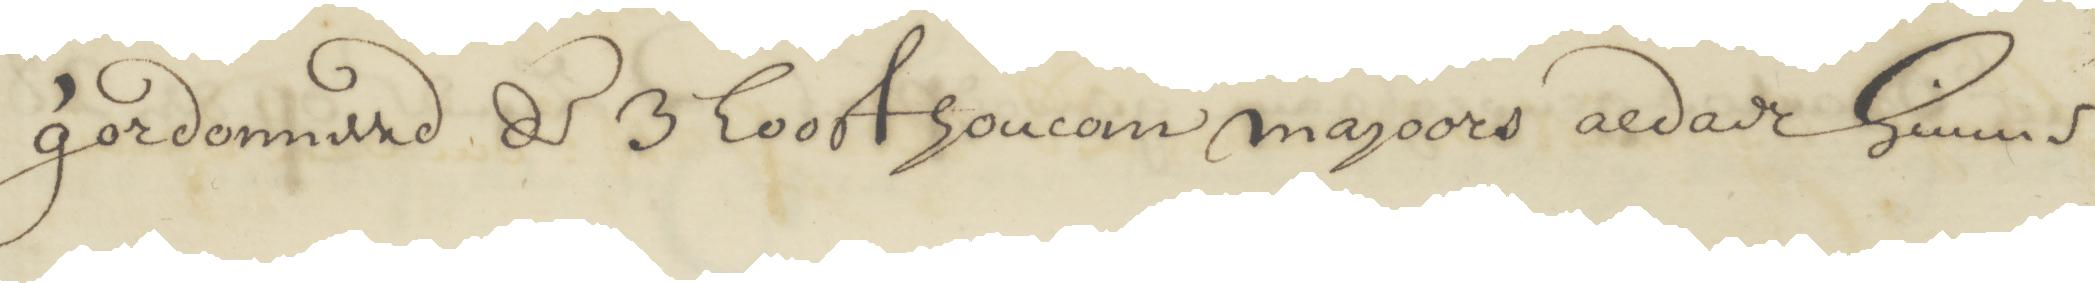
g'ordonneerd de 3 hooft houcom majoors aldaer hunne
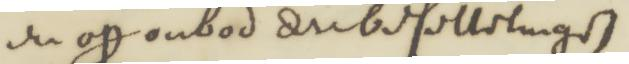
en op onbod den besettelingen
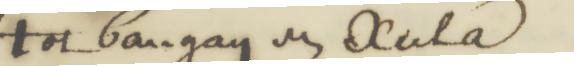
tot bangay en xula
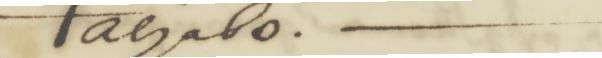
taljabo. —
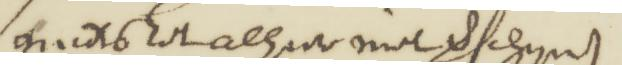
niets het alhier niet verschynen
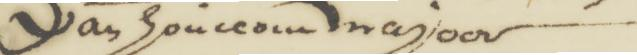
van houcom majoor
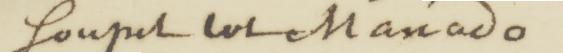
soupet tot Manado
